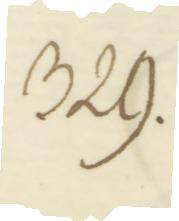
329.
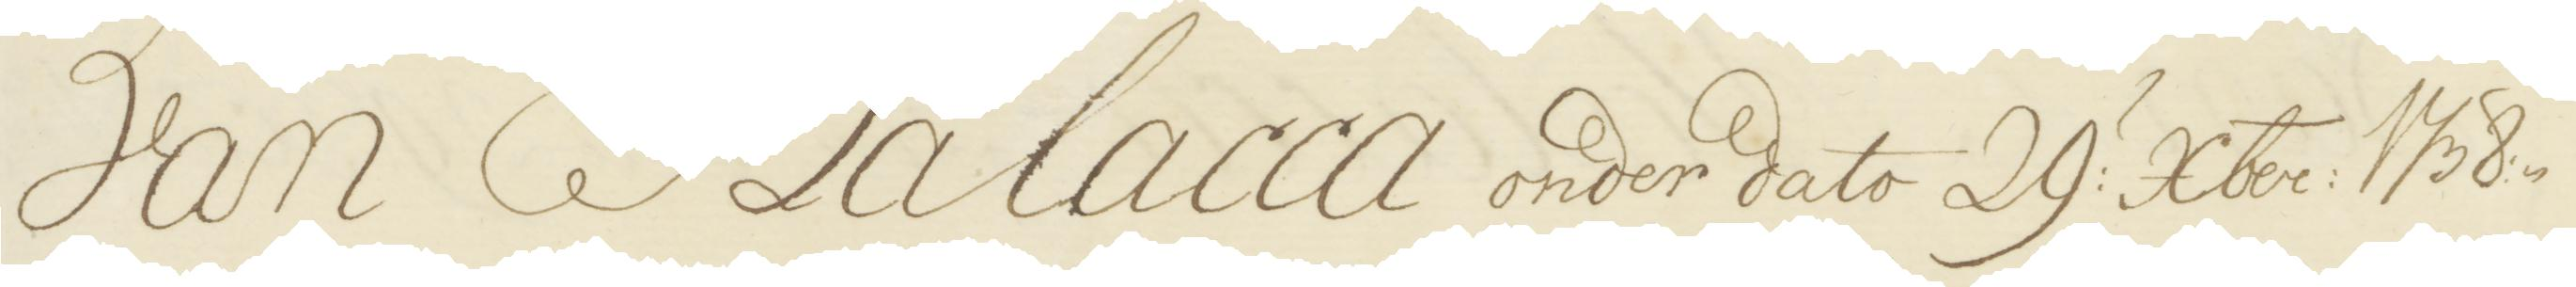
Van Malacca onder dato 29:' xber: 1738:
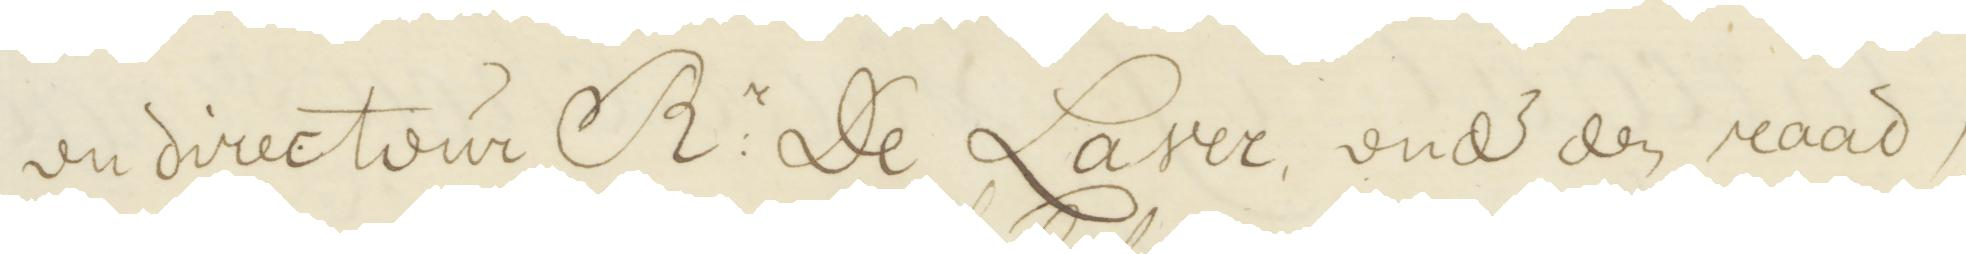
en directeur R:r De Laver, ende den raad,
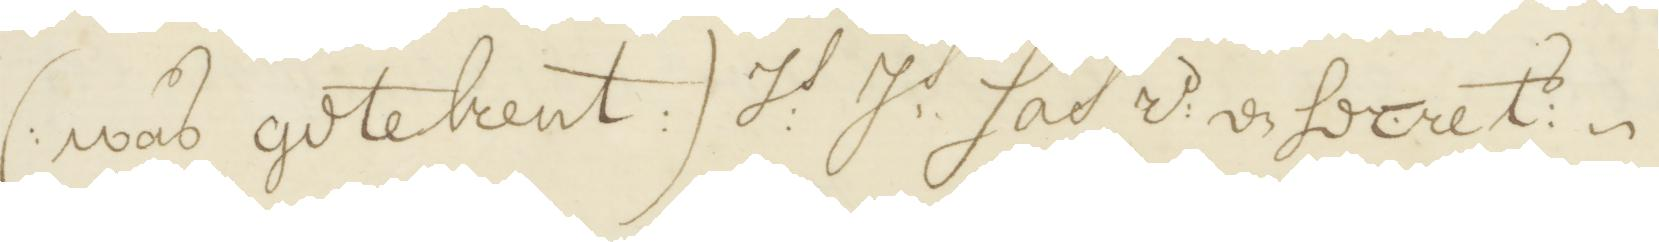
(:was getekent:) J:s J:s sas r:d en secret:s
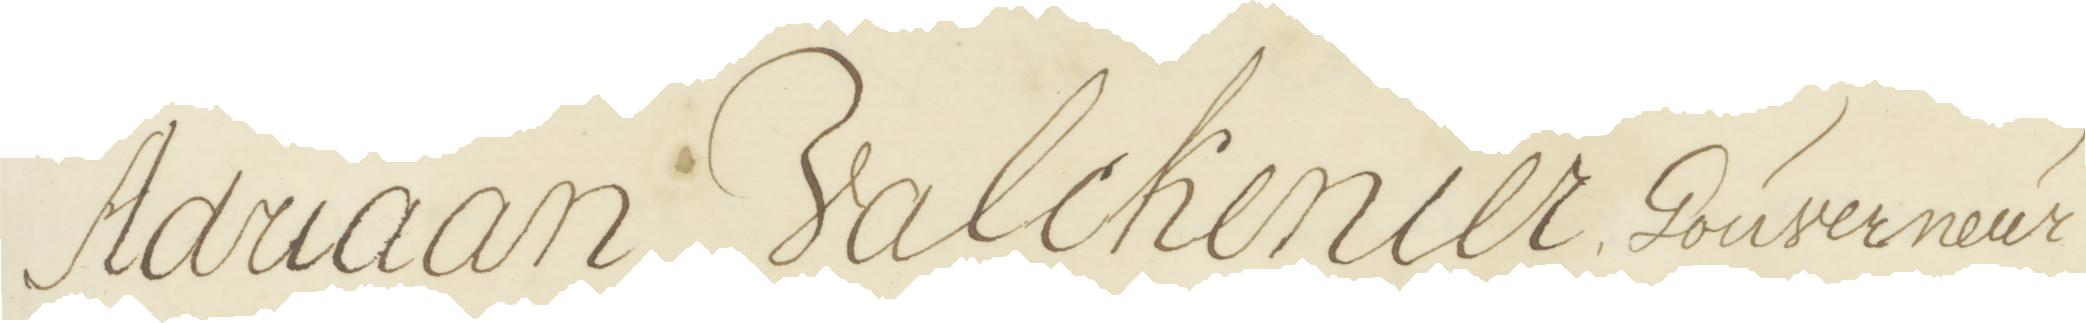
Adriaan Valckenier, Gouverneur
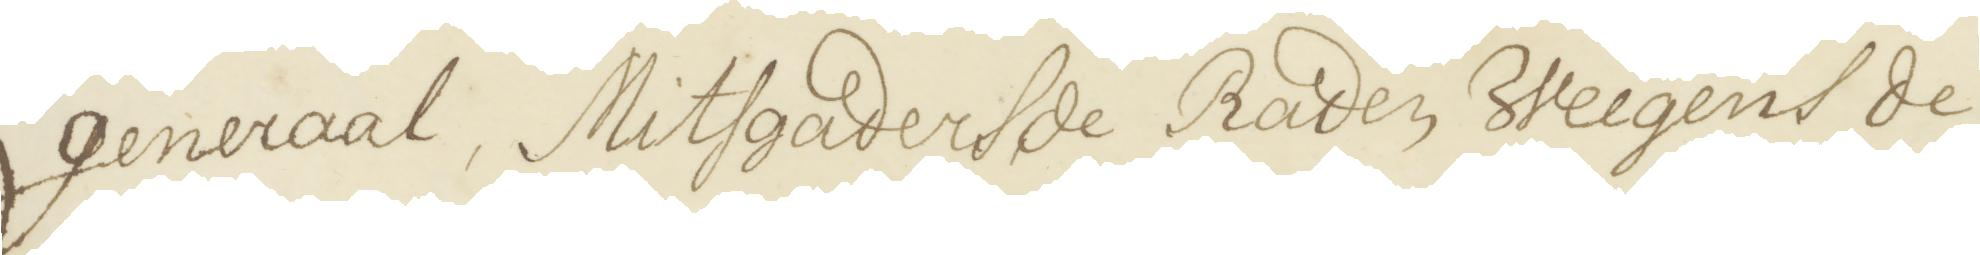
generaal, Mitsgaders de Raden weegens de
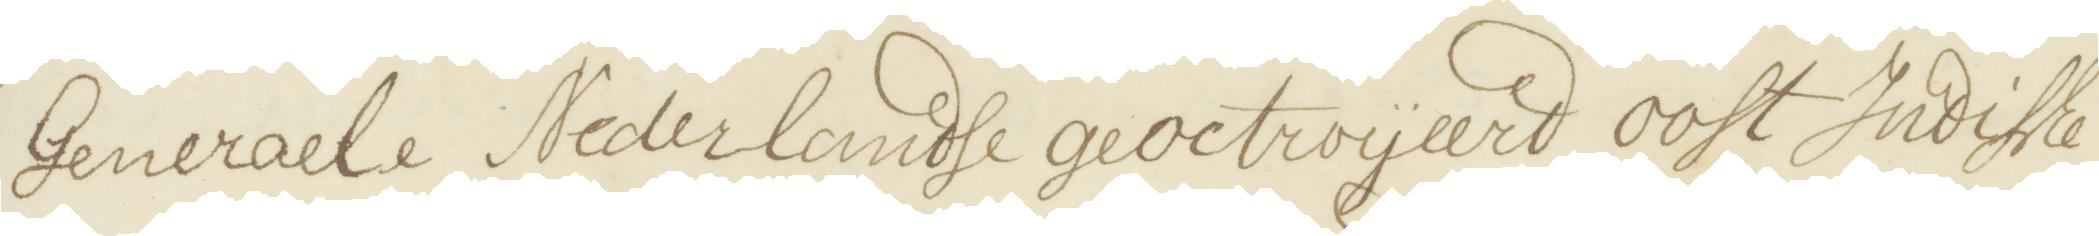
Generaele Nederlandse geoctroijeerd oost Jndische
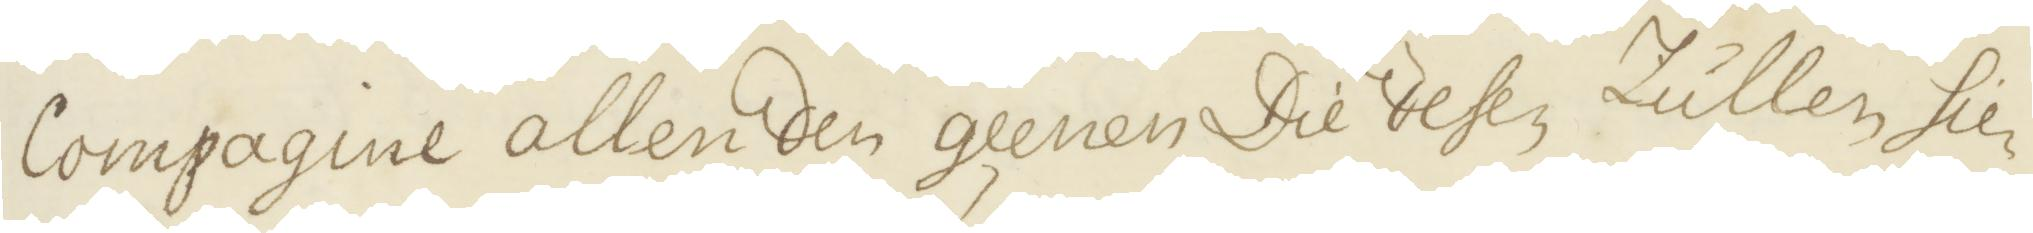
compagine allen den geenen Die desen zullen sien
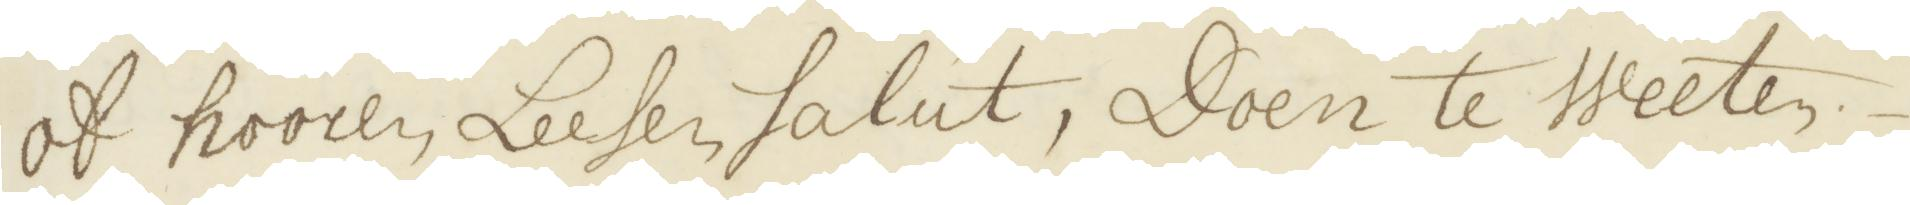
of hooren leesen salut, Doen te weeten.
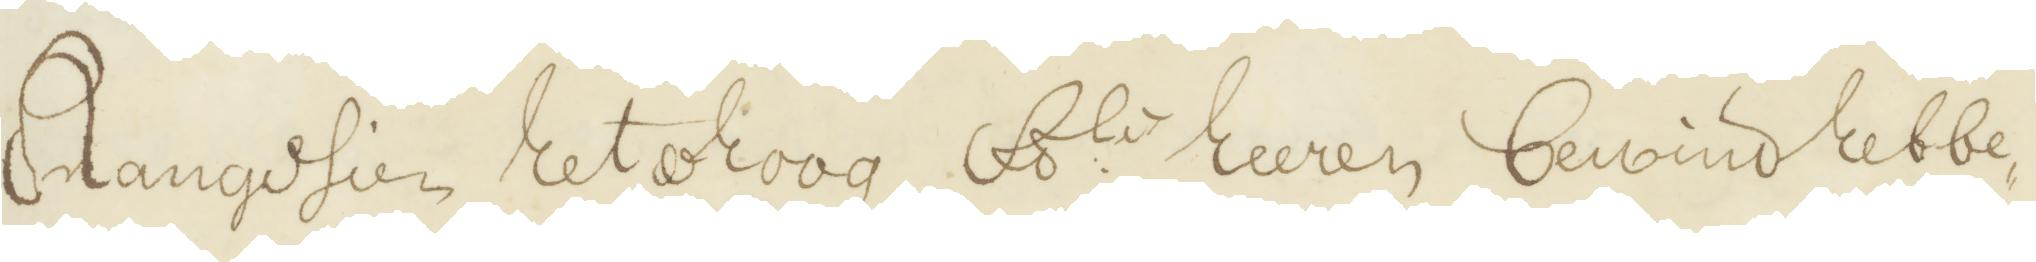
Aangesien het de hoog Ed:e heeren bewind hebbe„
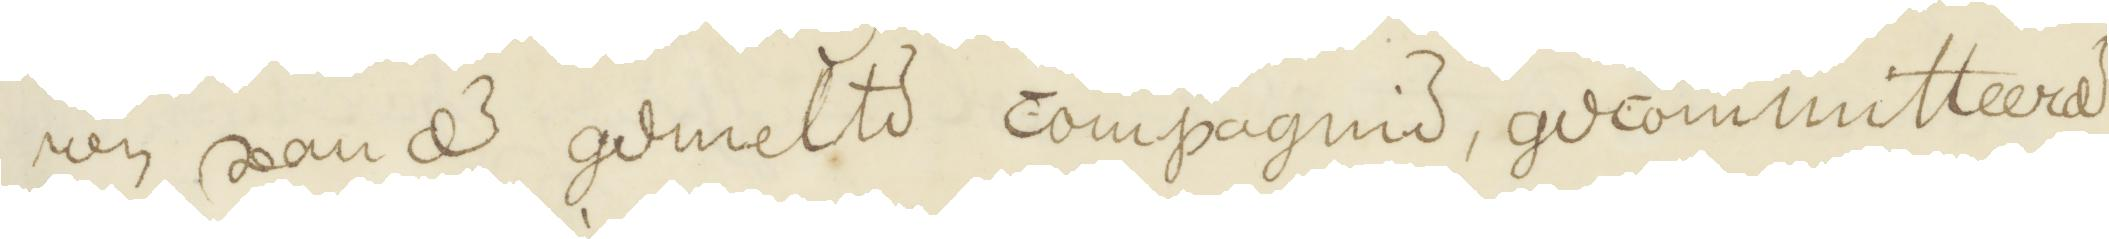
ren van de gemelte compagnie, gecommitteerde
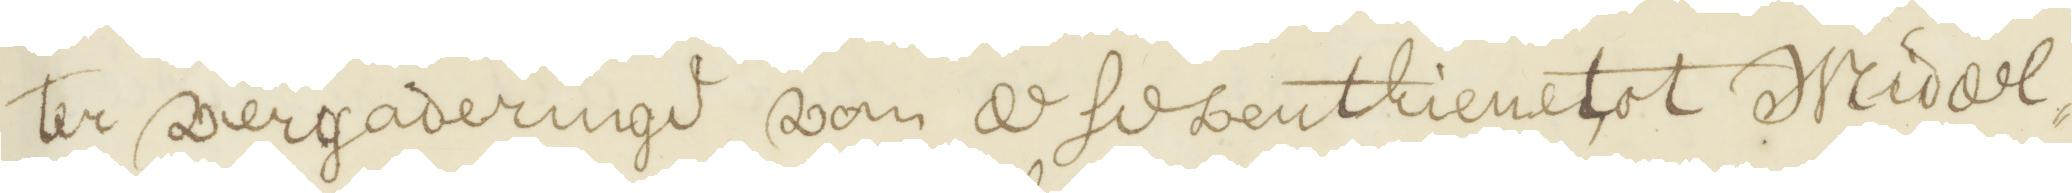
ter vergaderinge van de seventhiene tot Middel„
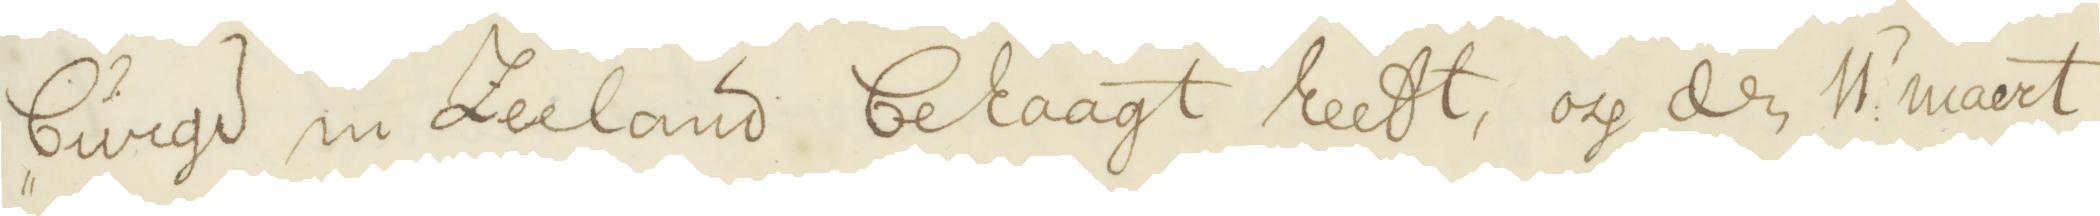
„burge in Zeeland behaagt heeft, op den 11:' maert
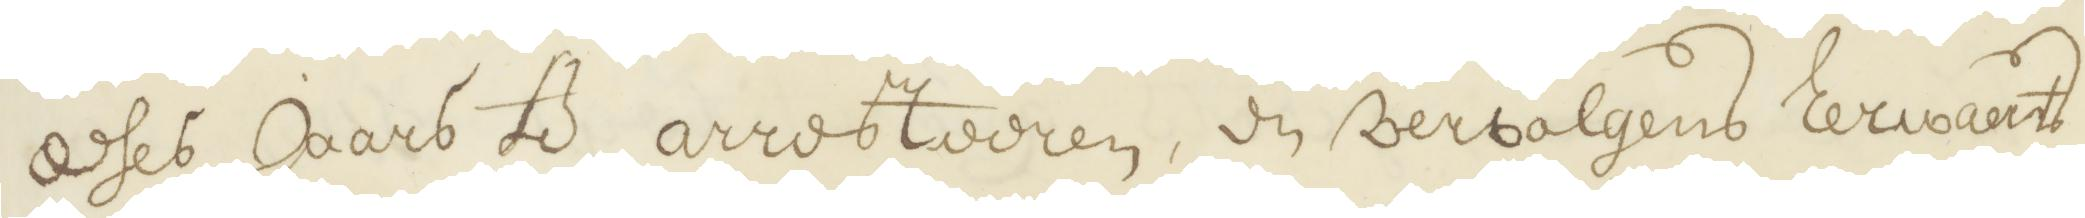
deses jaars te arresteeren, en vervolgens herwaerts
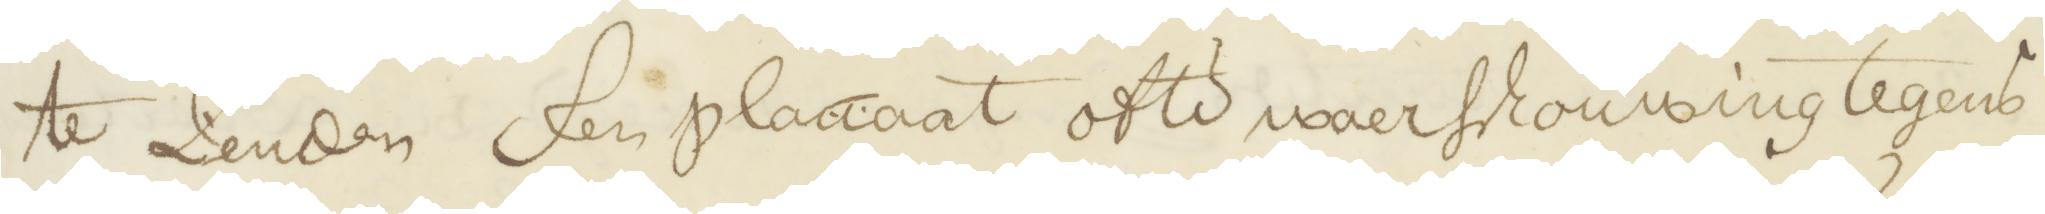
te zenden Een placcaat ofte waerschouwing tegens
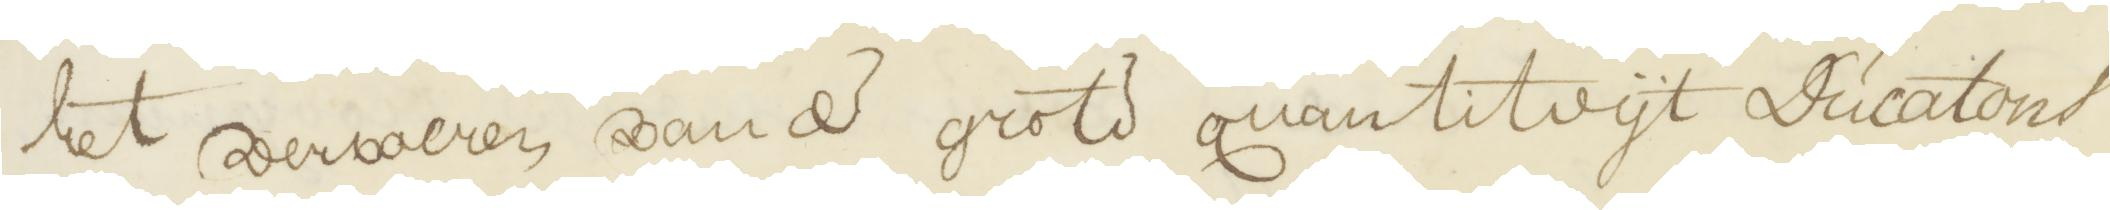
het vervoeren van de grote quantiteijt Ducatons
